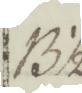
13½
